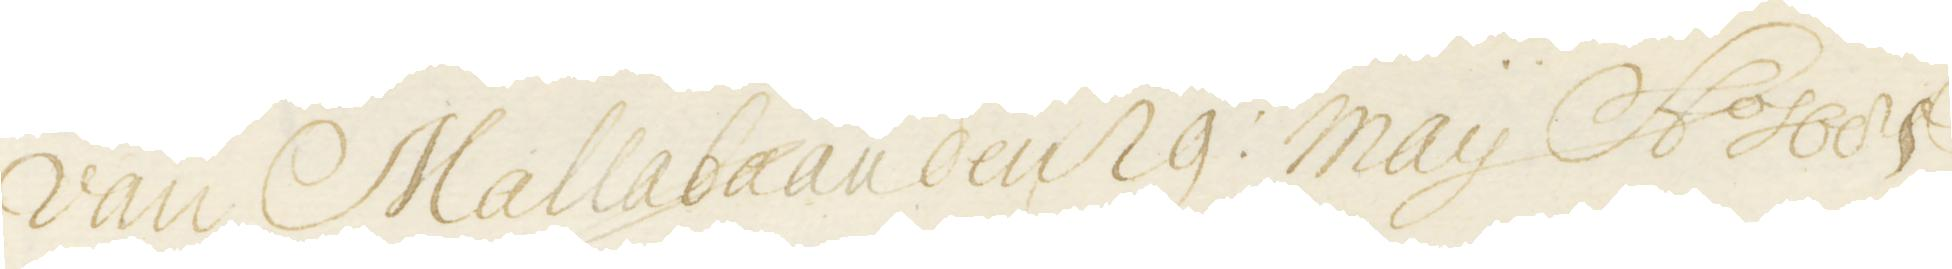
van Mallabaar den 29:n maij Ao 1685
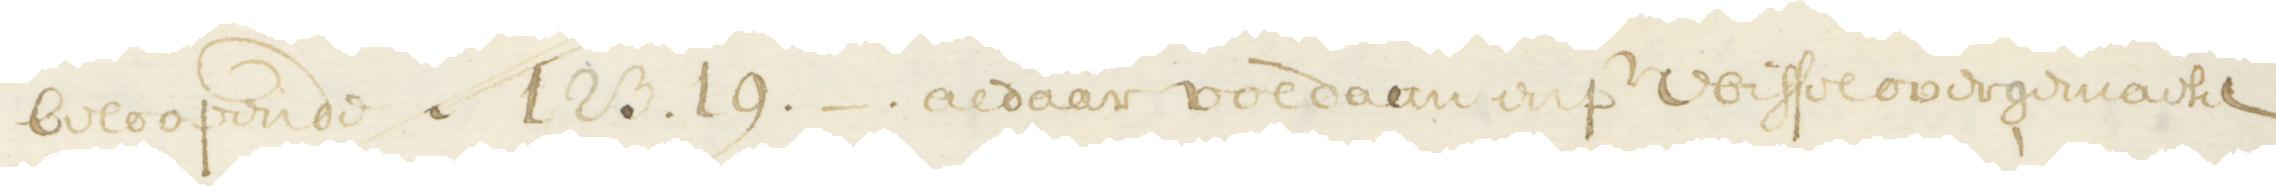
beloopende ƒ 123. 19. —. aldaar voldaan en pr wissel overgemaekt
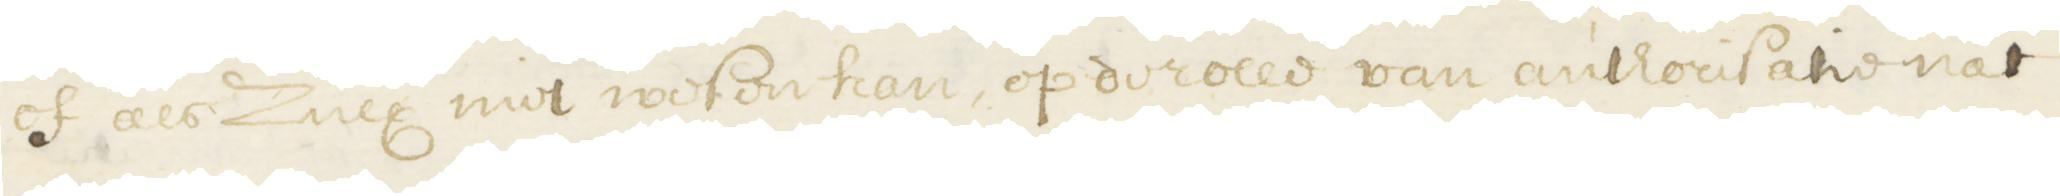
of als zulx niet wesen kan, op de rolle van authorisatie na 't
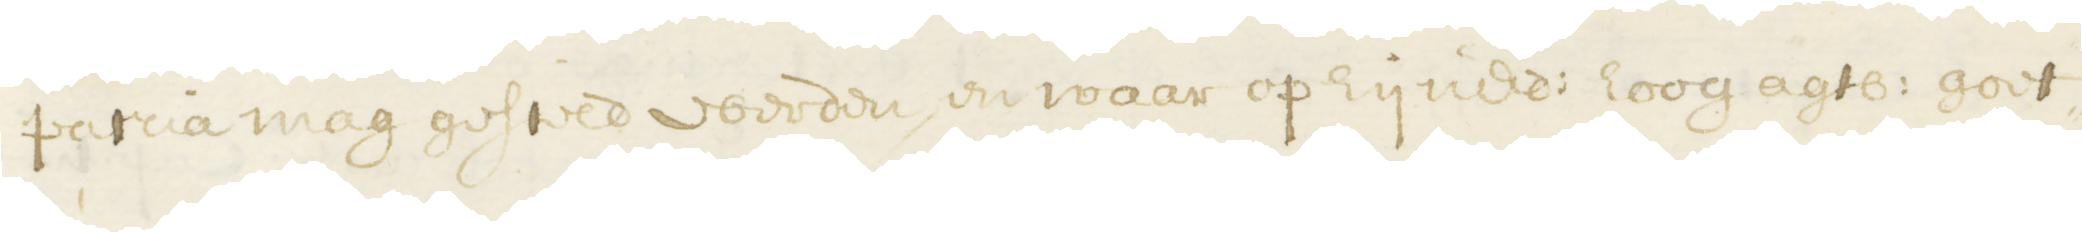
patria mag gesteld werden, en waar op hij uEd: hoog agtb: goet
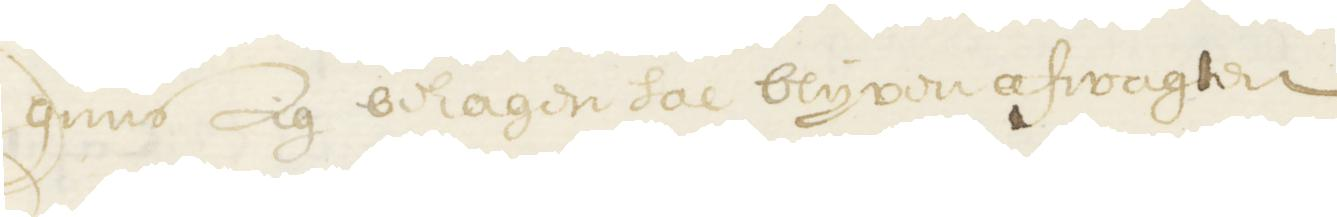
gunstig behagen sal blijven afwagten
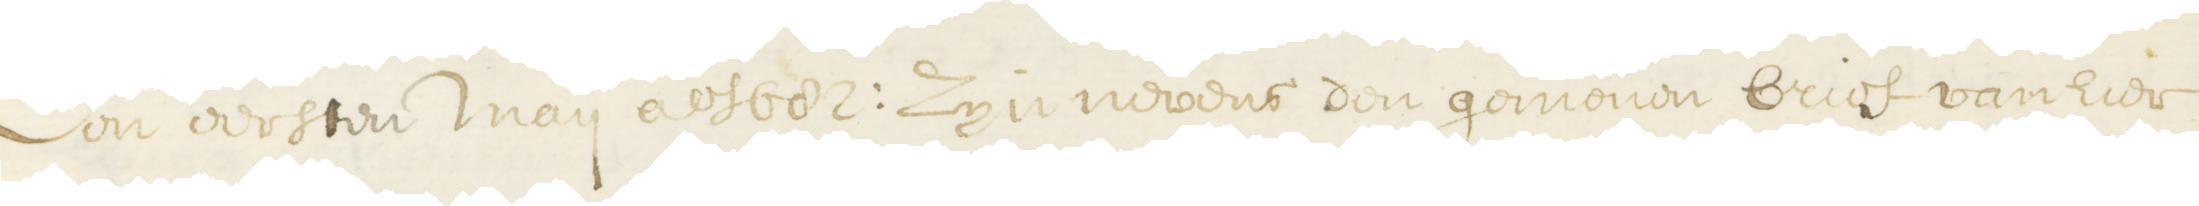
Den eersten maij ao 1682: zijn nevens den gemenen brief van hier
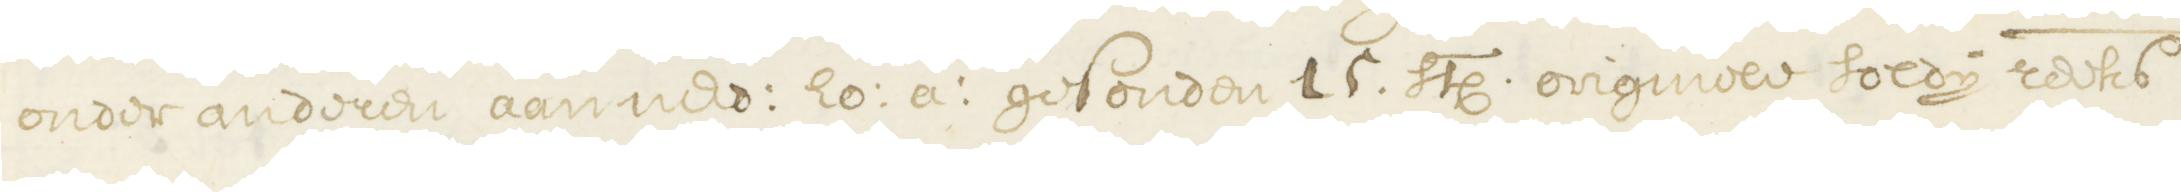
onder anderen aan uEd: ho: a: gesonden 15. stx originele soldij reeks
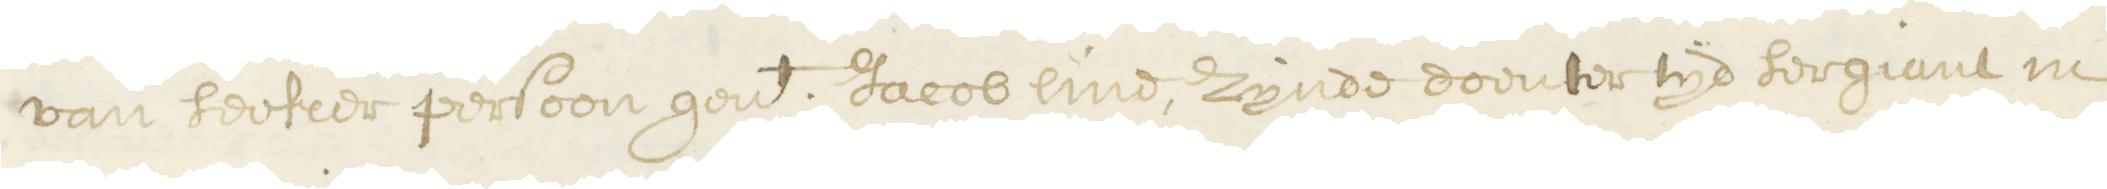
van seeker persoon gen.t Iacob Line, zijnde doentertijd sergiant in
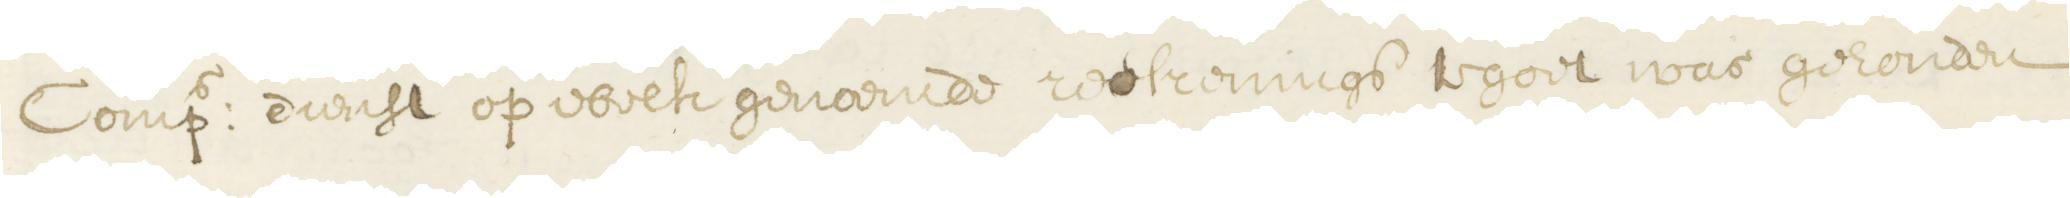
Comp:s dienst op welk genoemde reekenings te goet was gehouden
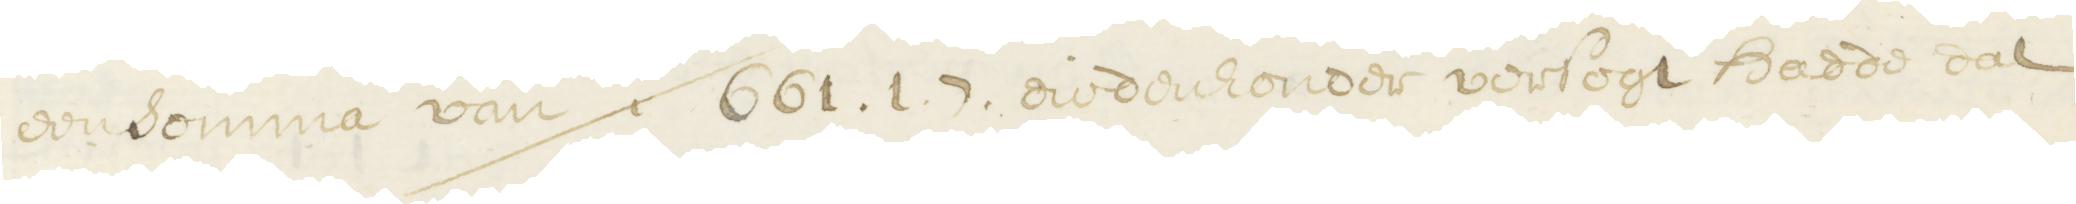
een somma van ƒ 661. 1. 7. die den houder versogt hadde dat
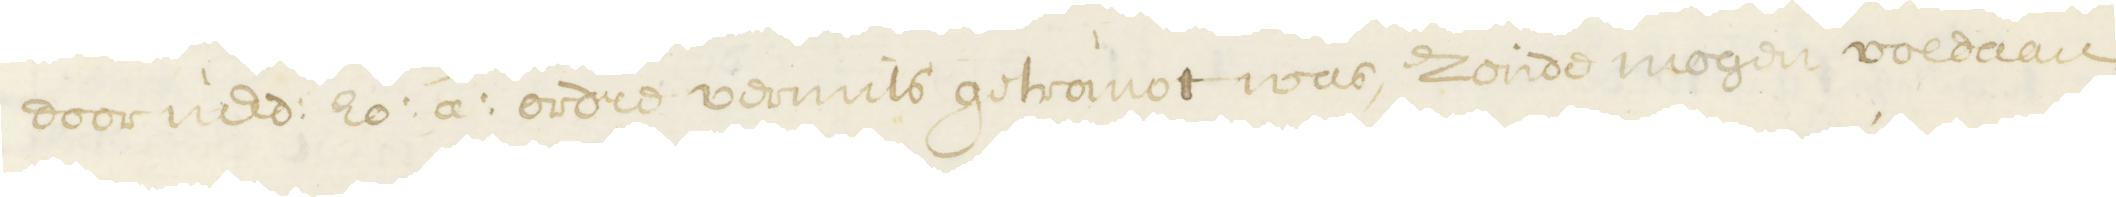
door uEd: ho: a: ordre vermits getrauwt was, zoude mogen voldaan
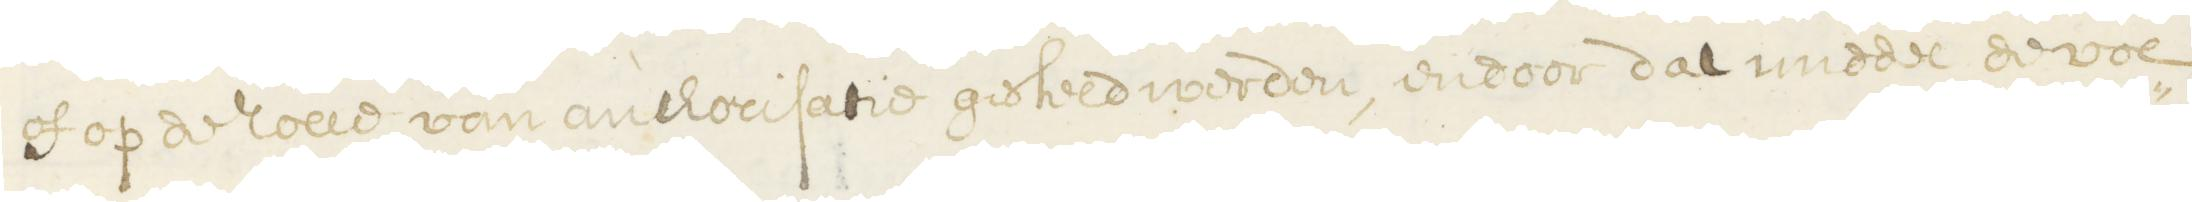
of op de Rolle van authorisatie gesteld werden, en door dat middel de vol„
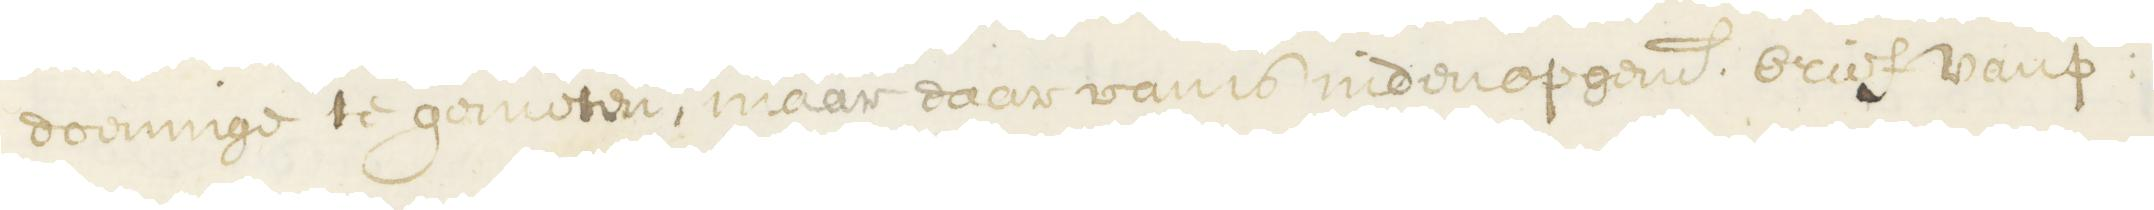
doeninge te genieten, maar daar van is inden opgem. brief van p:o
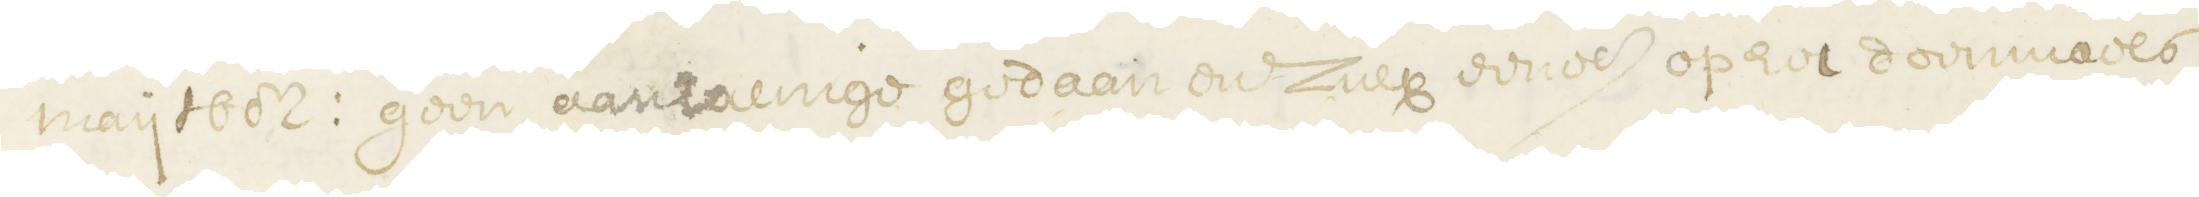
maij 1682: geen aanhalinge gedaan en zulx eenelijk op het doenmaels
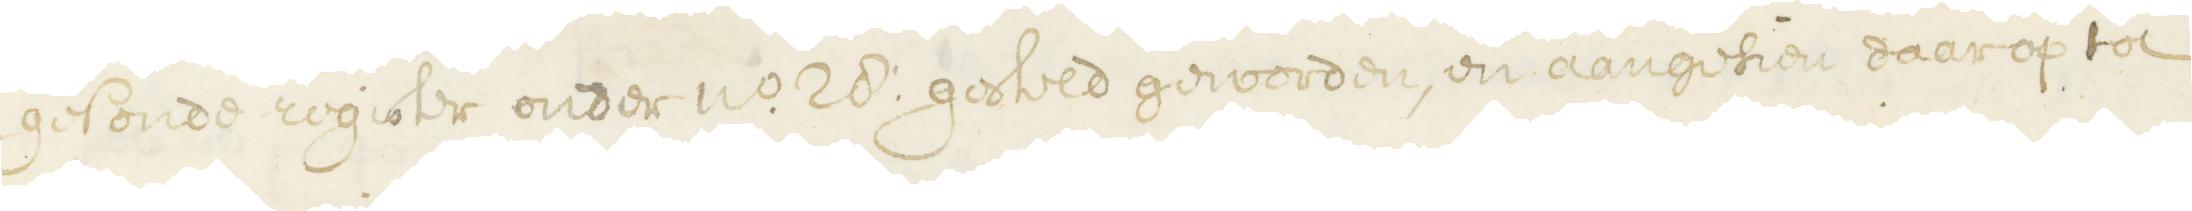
gesonde register onder n.o 28: gesteld geworden, en aangesien daarop tot
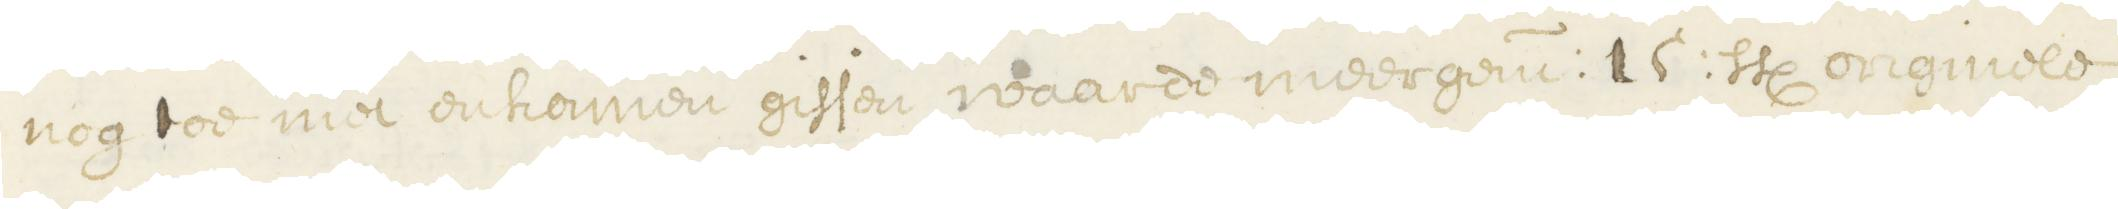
nog toe niet en konnen gissen waar de meer gem: 15: stx originele
